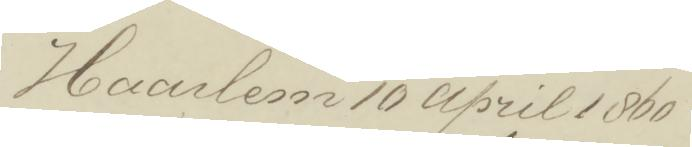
Haarlem 10 April 1860
